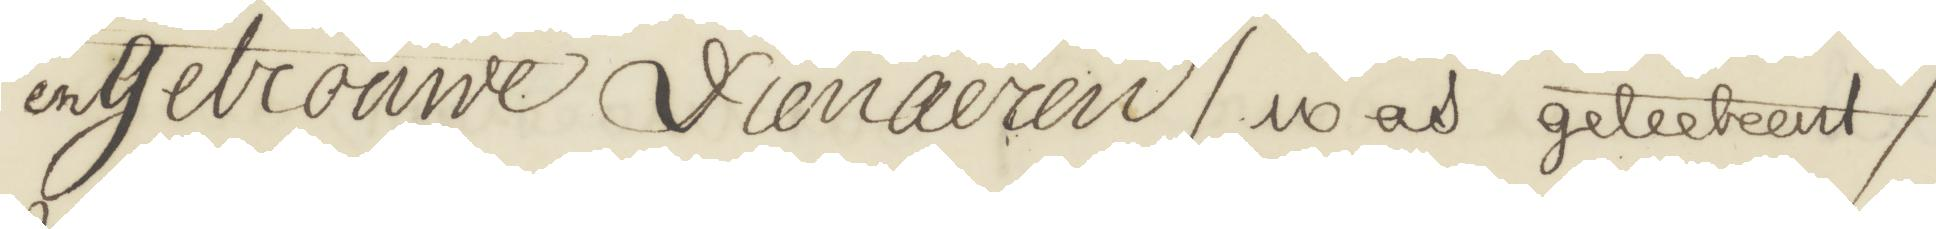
en getrouwe dienaeren /was geteekent/
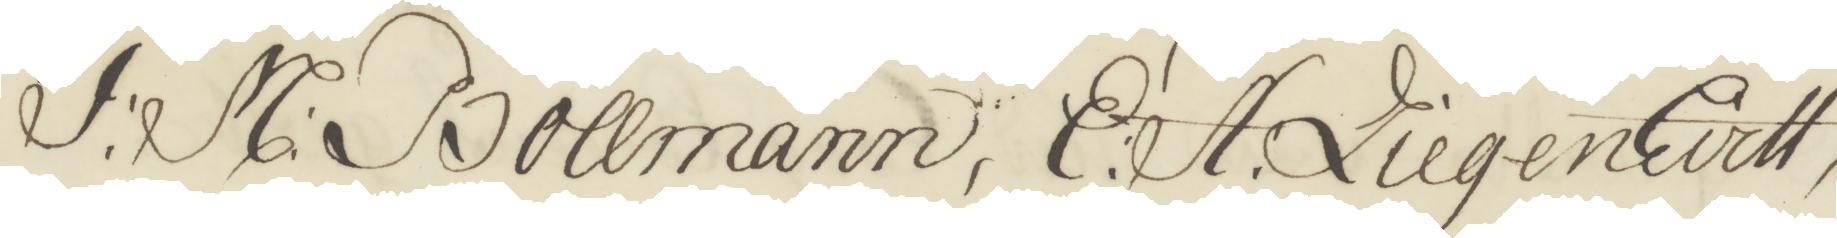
J: M: Bollmann, E: A: Ziegenhirtt,
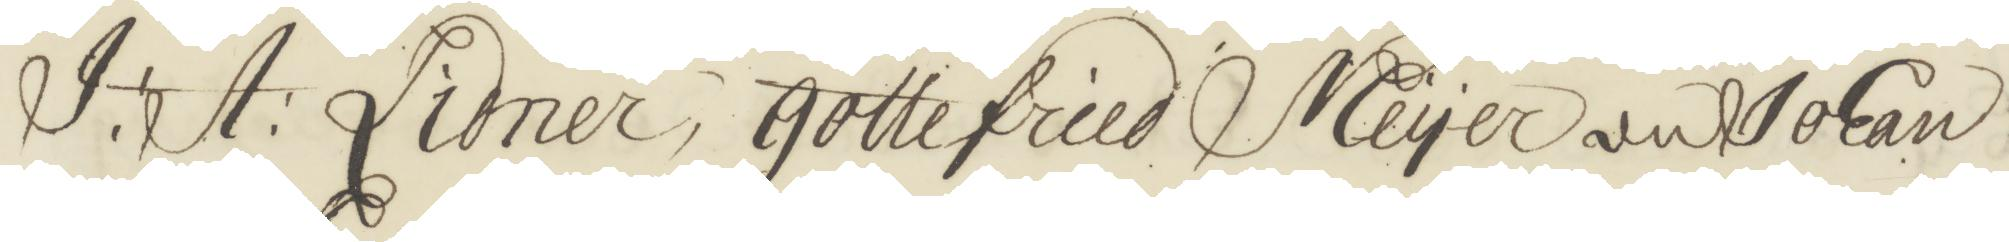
J: A: Lidner, gottefried Meijer en Johan
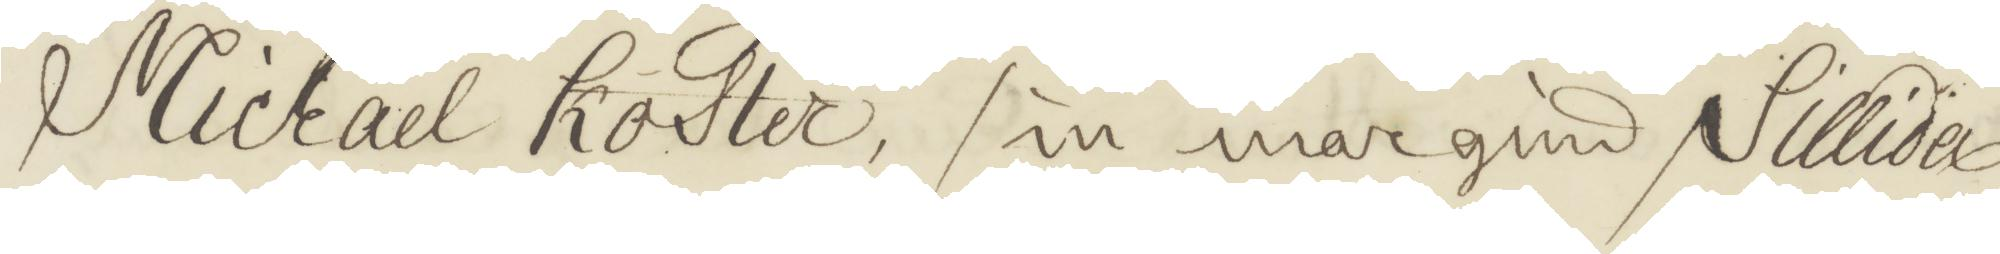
Michael koster, /in margine/ Sillida
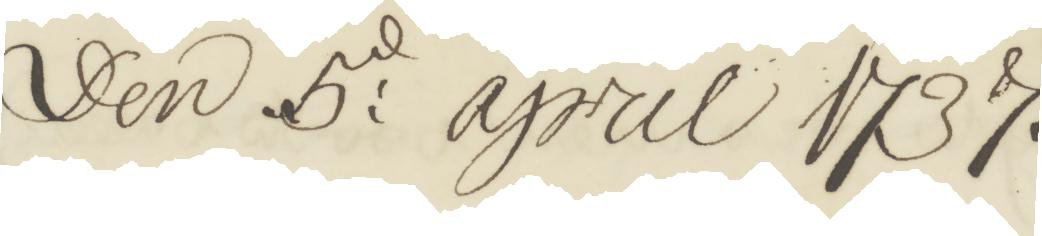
Den 5:e april 1737. —
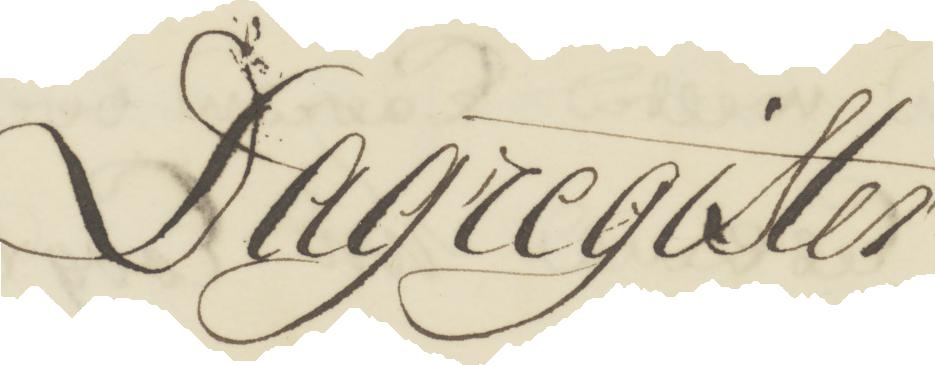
Dagregister
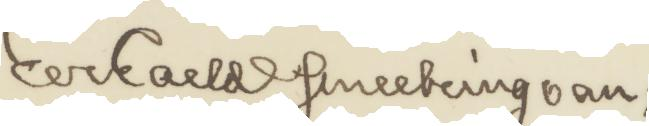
Eerhaelde smeeking van
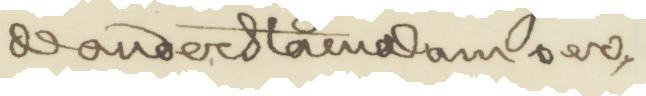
de onderstaende om ver
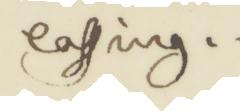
lossing.—
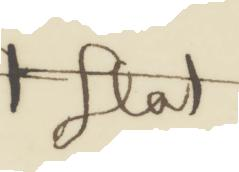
't slot
